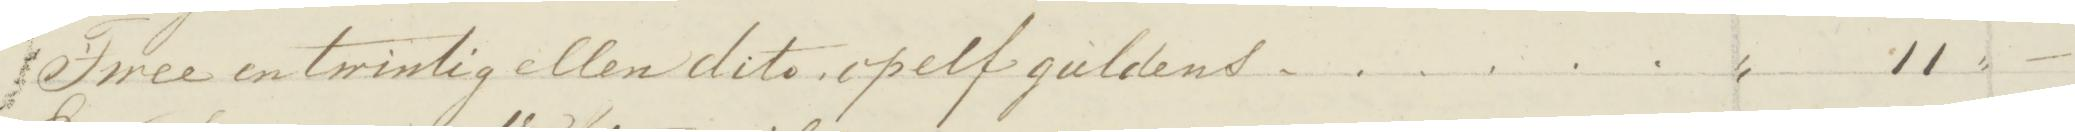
Twee en twintig ellen dito, op elf guldens - - - - - - „ 11 „ —
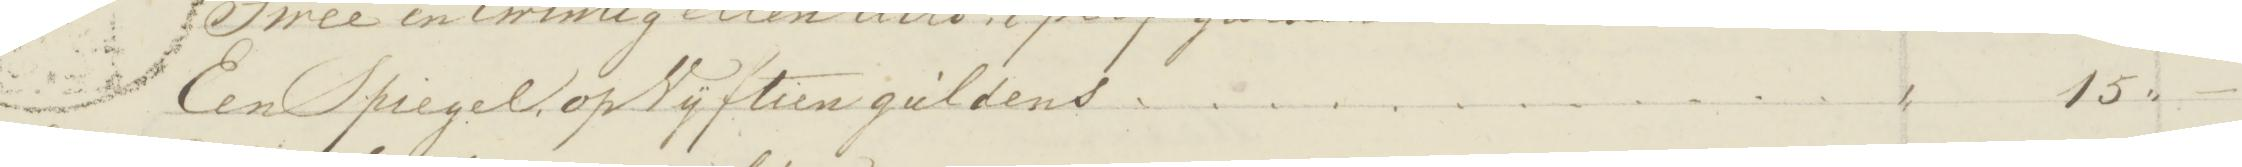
Een Spiegel, op Vijftien guldens - - - - - - - - - - - - „ 15„ —
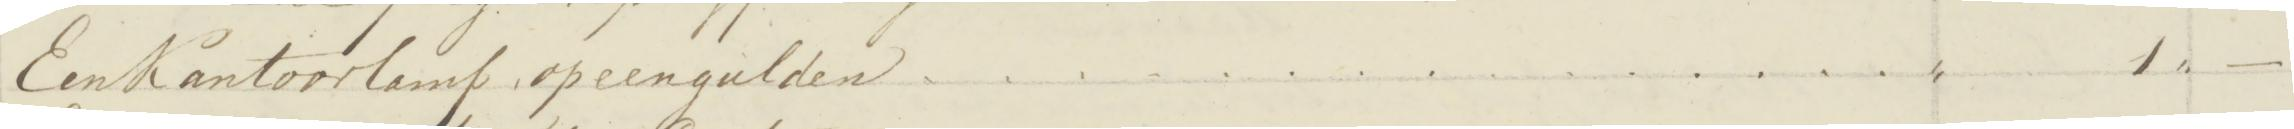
Een Kantoorlamp, op een gulden - - - - - - - - - - - - - - - „ 1„ —
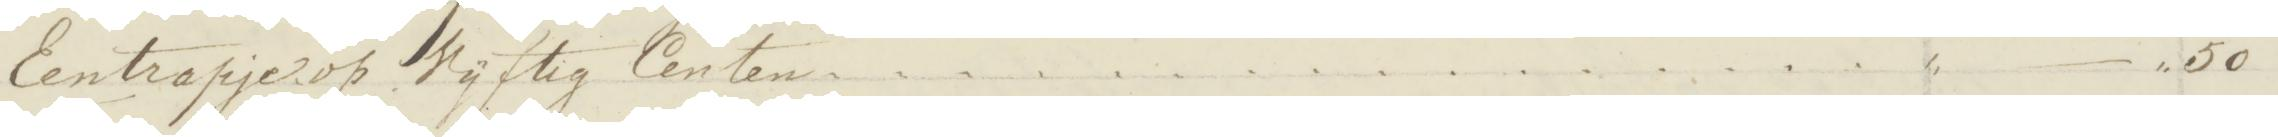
Een trapje, op Vijftig Centen - - - - - - - - - - - - - - - - „ — „50
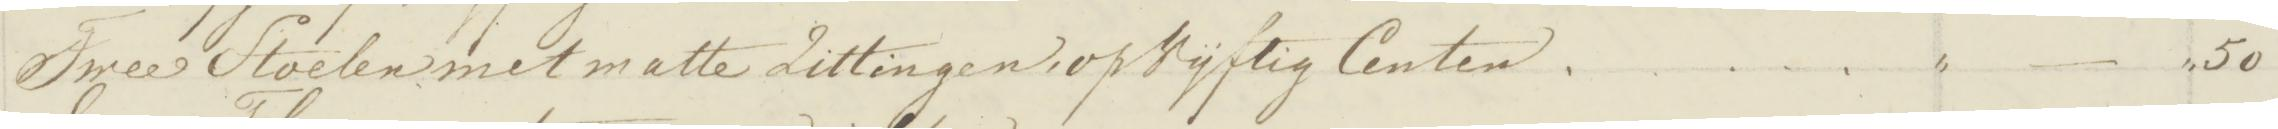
Twee Stoelen met matte zittingen, op Vijftig Centen - - - - - „ — „50
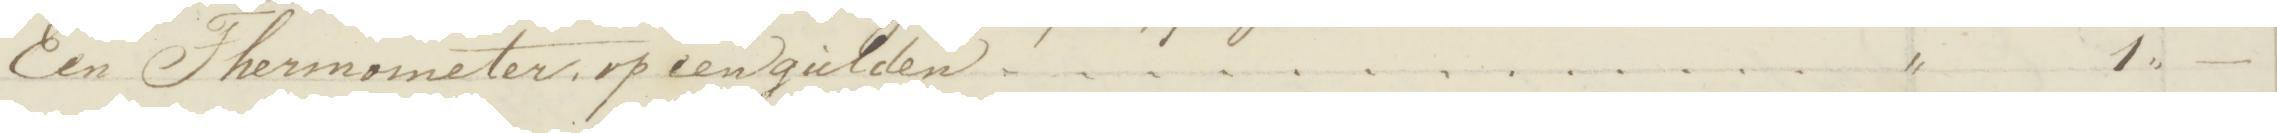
Een Thermometer, op een gulden - - - - - - - - - - - - - „ 1„ —
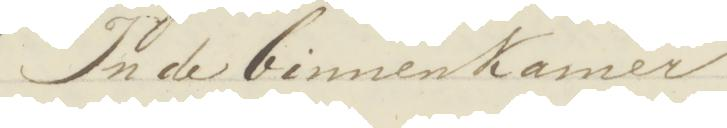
In de binnen Kamer
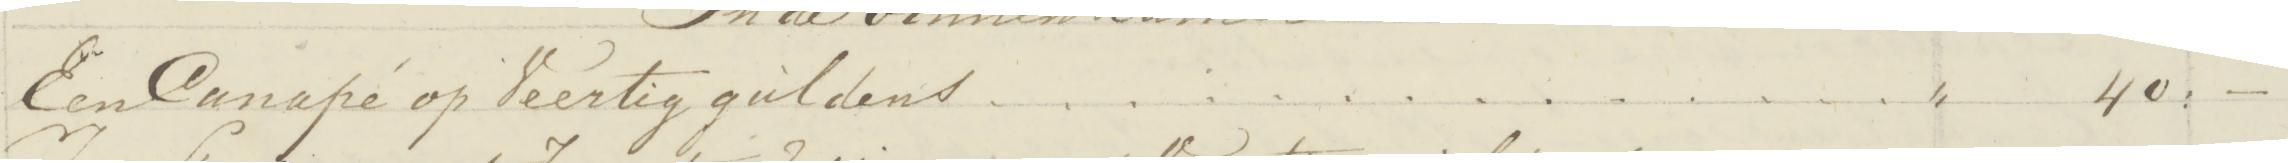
Een Canapé op Veertig guldens - - - - - - - - - - - - - „ 40„ —
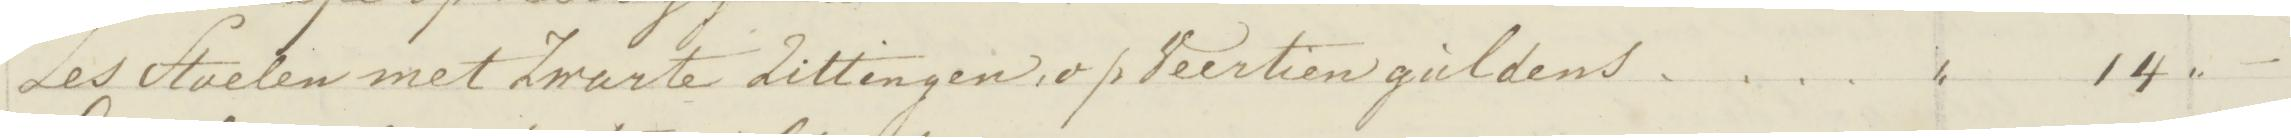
Zes stoelen met zwarte zittingen, op Veertien guldens - - - - „ 14 „ —
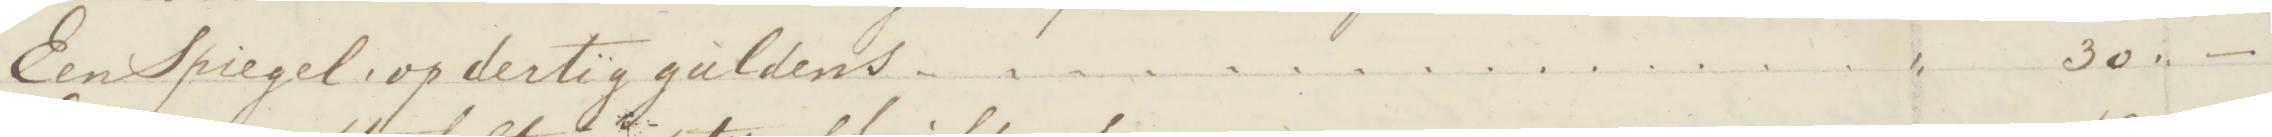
Een Spiegel, op dertig guldens - - - - - - - - - - - - - - - „ 30 „ —
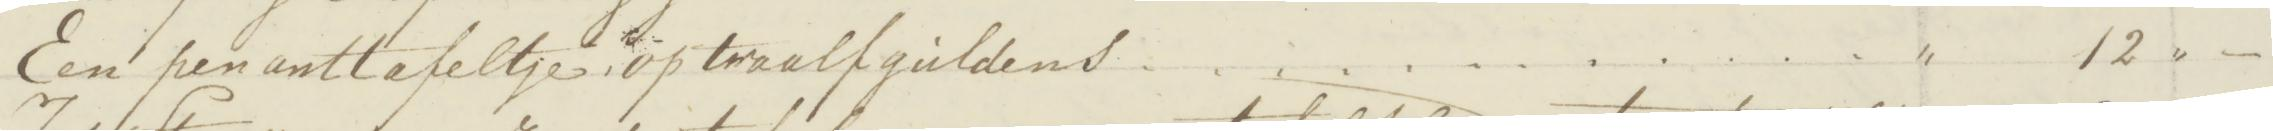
Een pen anttafeltje, op twaalf guldens - - - - - - - - - - - - „ 12 „ —
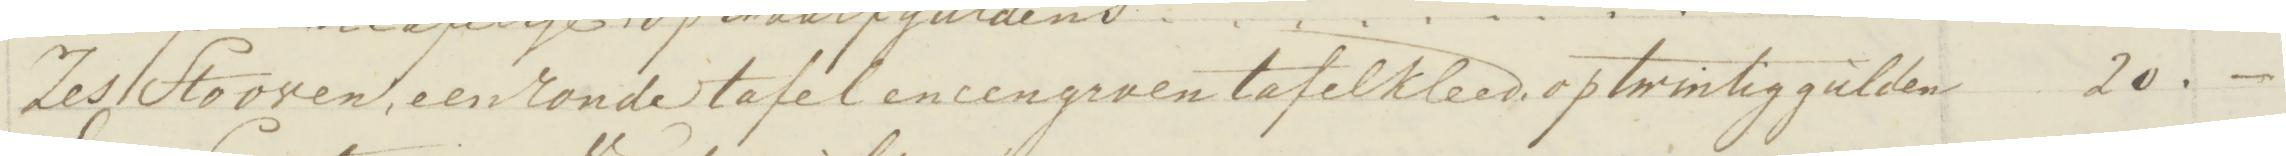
Zes Stooven, een ronde tafel en een groen tafelkleed, op twintig gulden 20 „ —
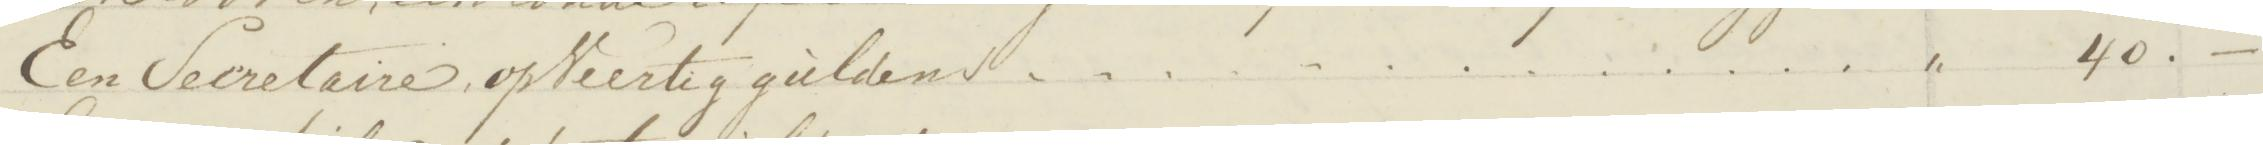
Een Secretaire, op Veertig guldens - - - - - - - - - - - - - „ 40 „ —
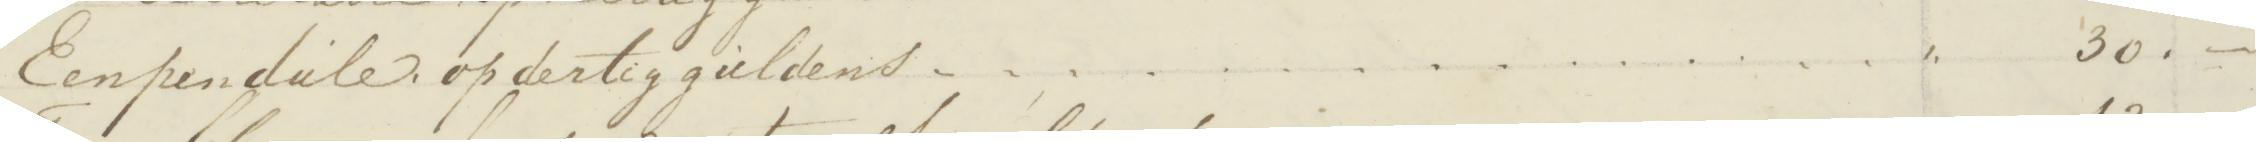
Een pendule, op dertig guldens - - - - - - - - - - - - - - - „ 30 „ —
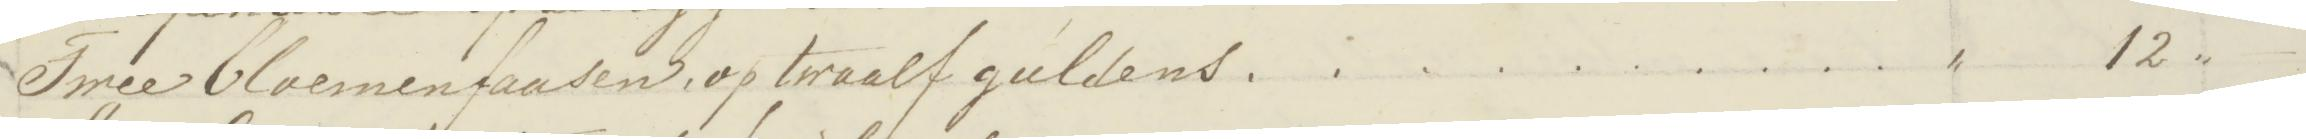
Twee bloemenfaasen, op twaalf guldens - - - - - - - - - - „ 12 „ —
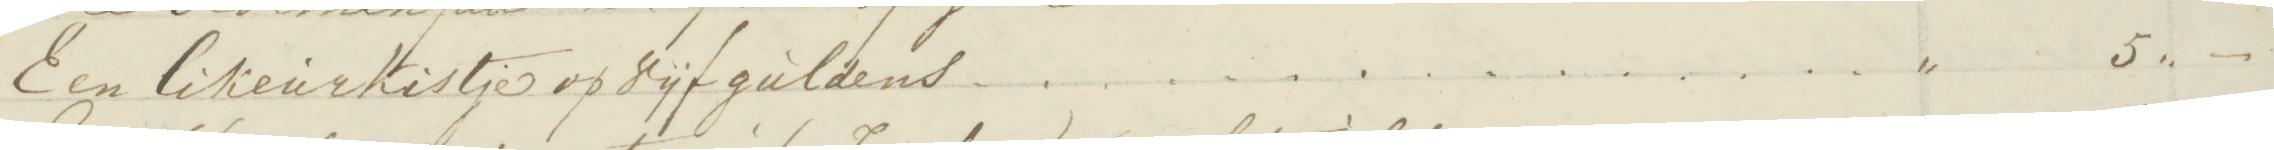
Een likeurkistje op vijf guldens - - - - - - - - - - - - - - - „ 5„ —
